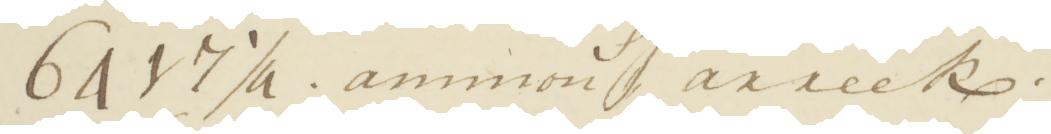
6417¼ . ammons„ arreek.
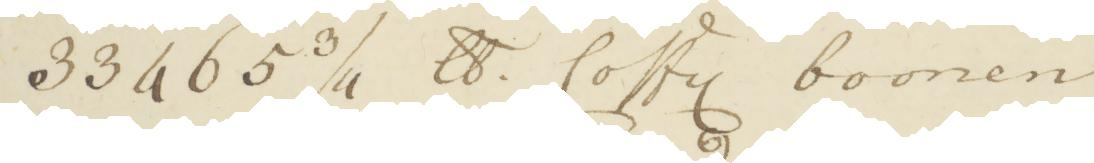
33465¾ lb. Coffy boonen
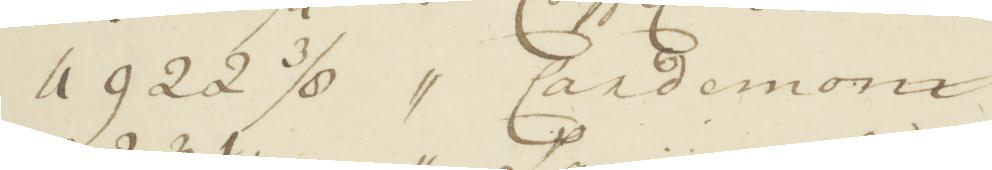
4922 3/8 „ Cardemom
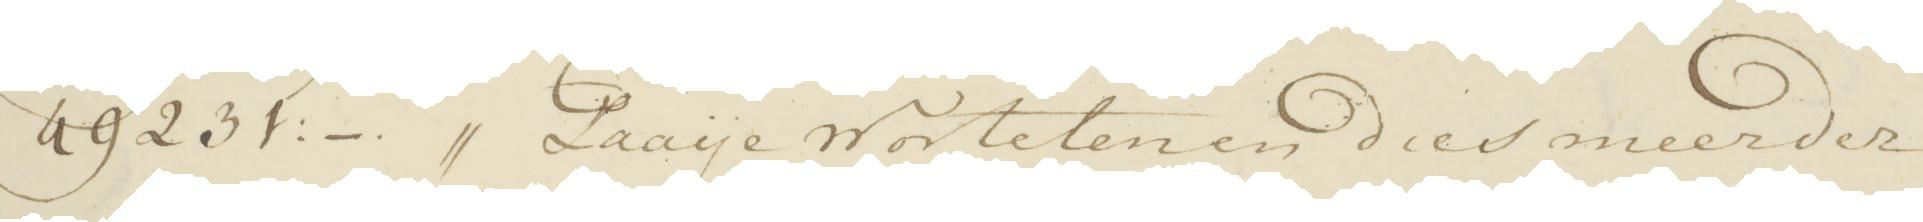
49231:—. „ Laaije wortelenen dies meer der
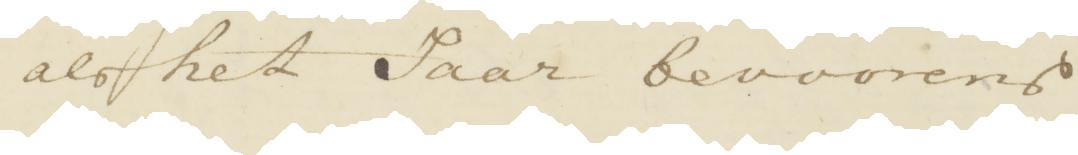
als het jaar bevoorens
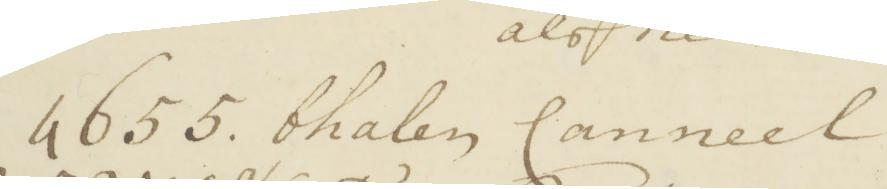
4655. bhalen Canneel
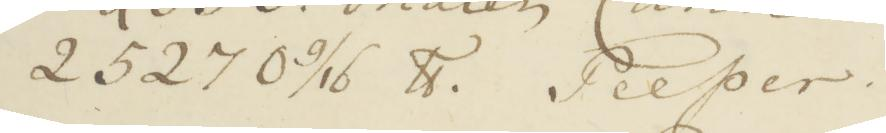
25270 9/16 lb. Peeper.
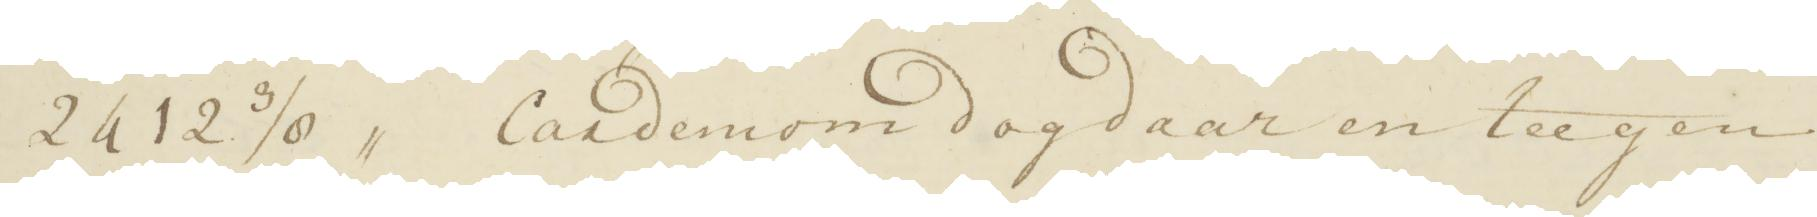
2412 3/8 „ Cardemom dog daar en teegen.
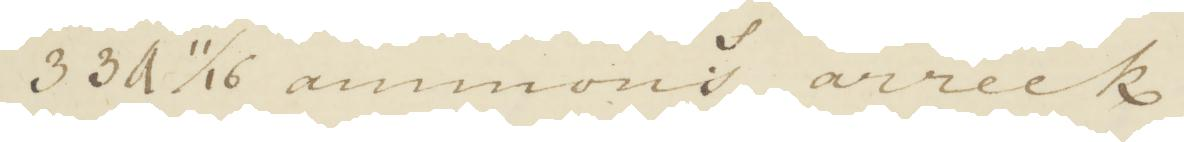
334 11/16 ammoni.s arreek
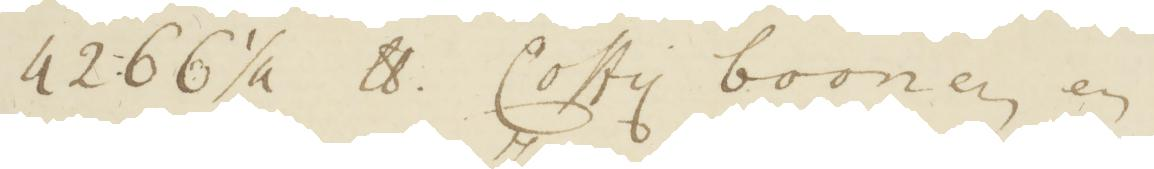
4266¼ lb. Coffij boonen en
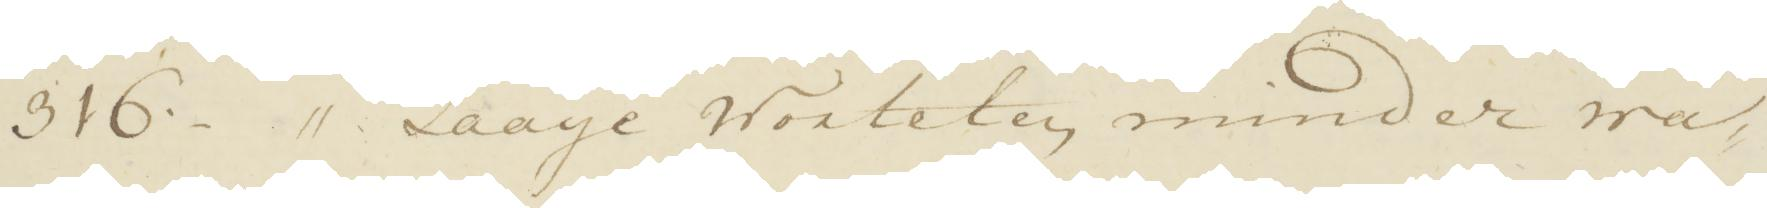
316:- . „ . Zaaije Wortelen minder wa„
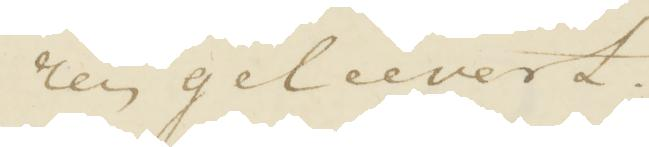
ren geleevert.
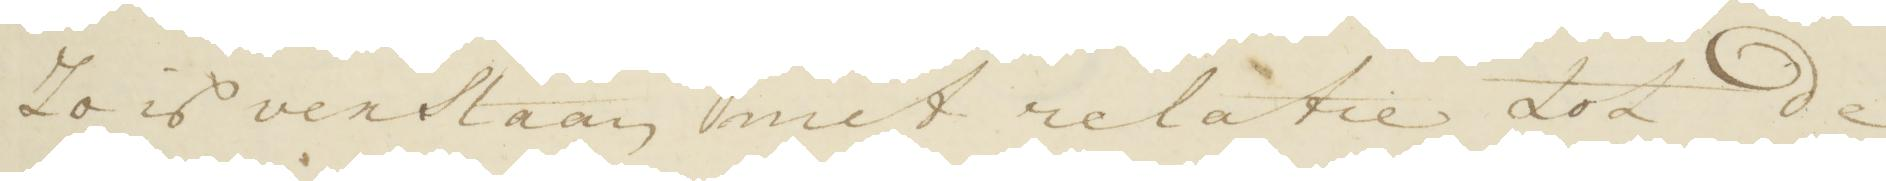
Zo is verstaan met relatie tot de
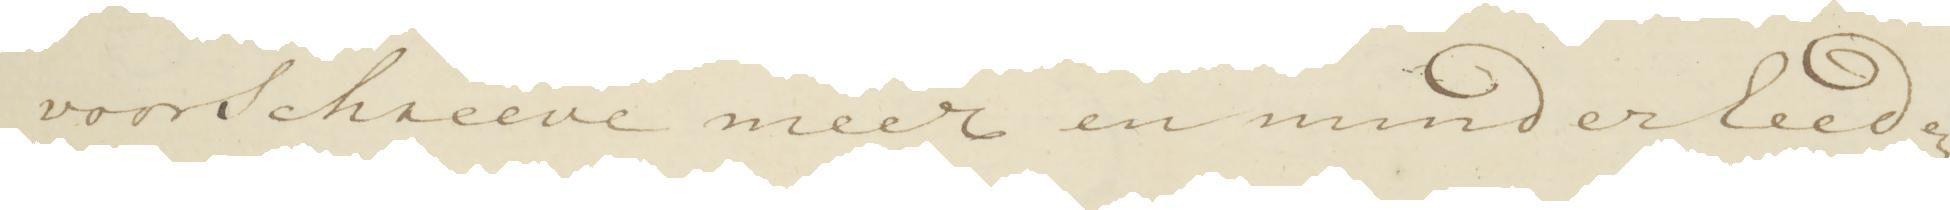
voorschreeve meer en minderleeden
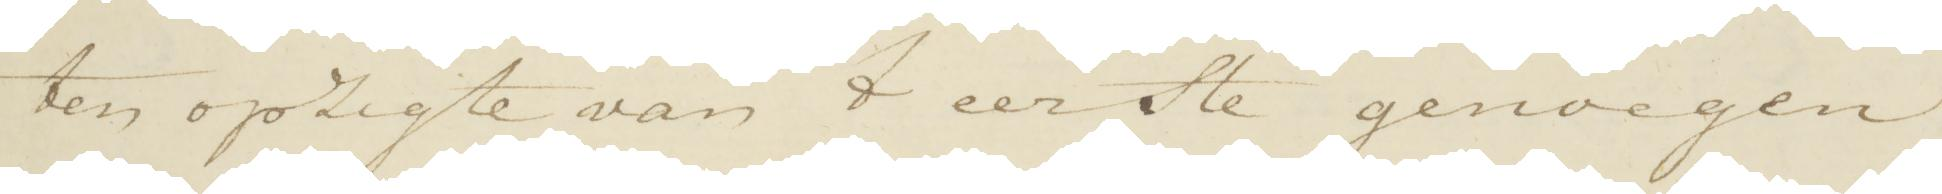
ten opzigte van 't eerste genoegen
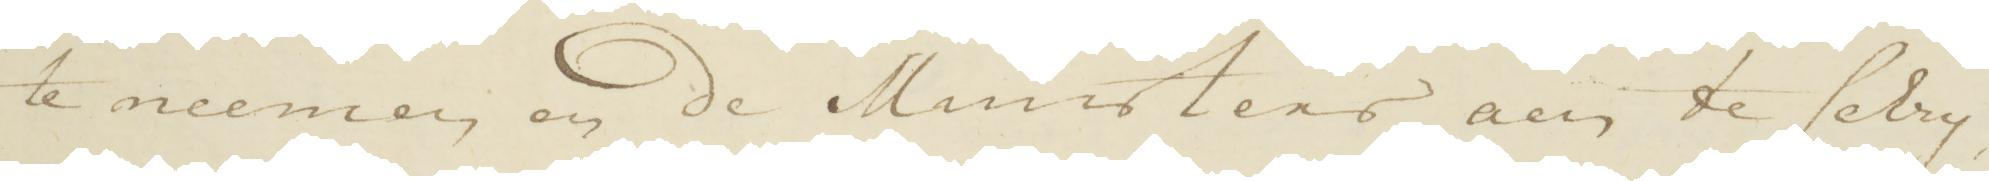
te neemen en de Ministers aen de schry„
